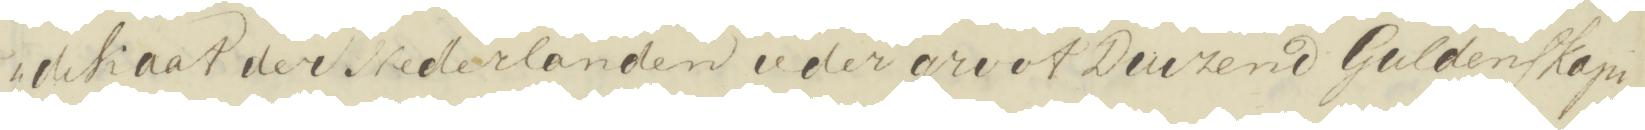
dikaat der Nederlanden ieder groot Duizend Guldens Kapi
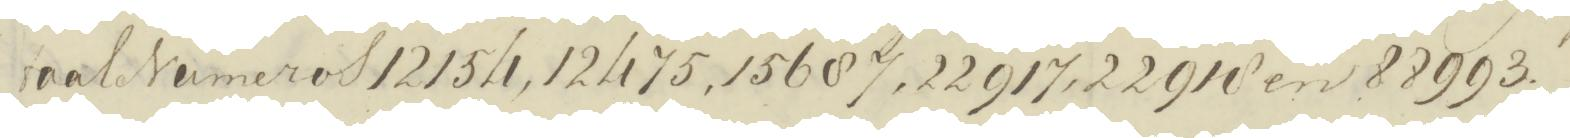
taal Numeros 12154, 12475, 15687, 22917, 22918 en 88993.
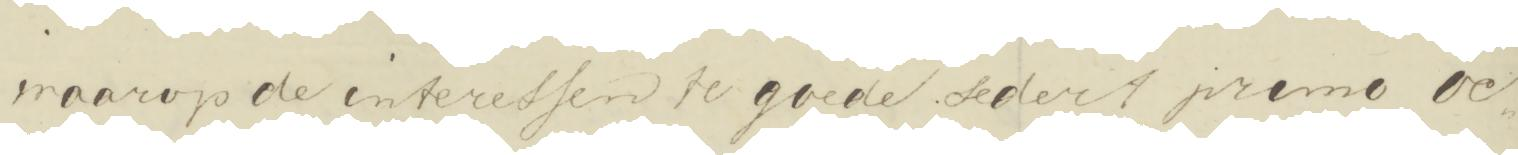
waarop de interessen te goede sedert primo oc„
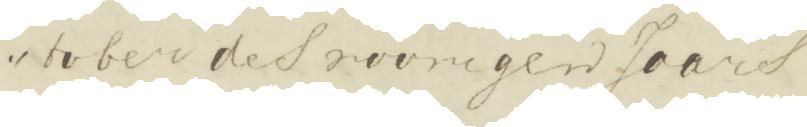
„tober des voorigen Jaars
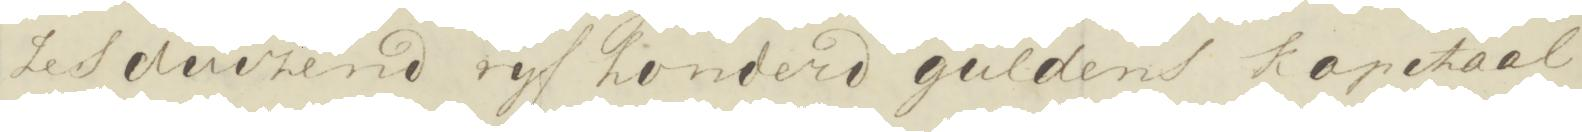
zes duizend vyf honderd guldens kapitaal
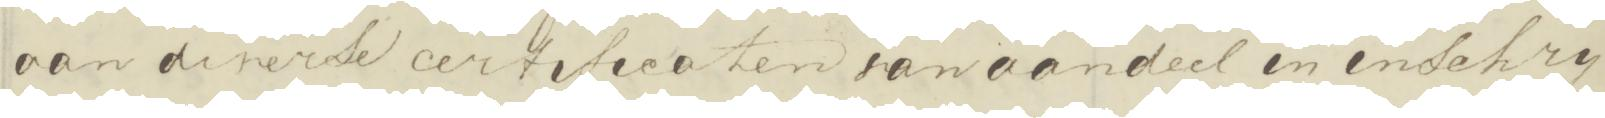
aan diverse certificaten van aandeel in inschry
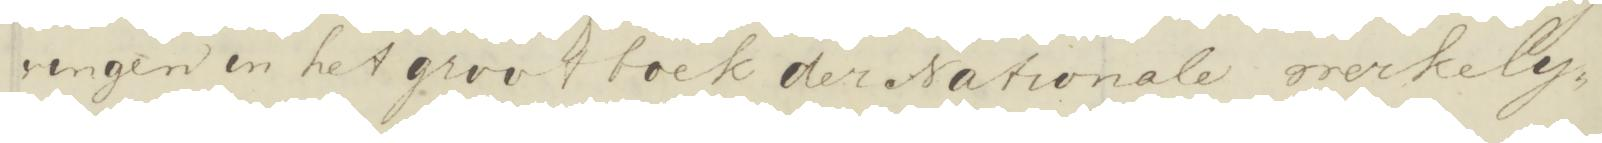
vingen in het grootboek der Nationale werkely„
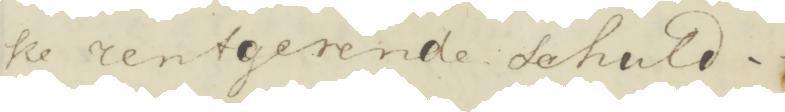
ke rentgevende schuld-
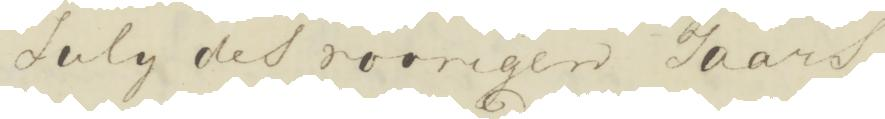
July des voorigen Jaars
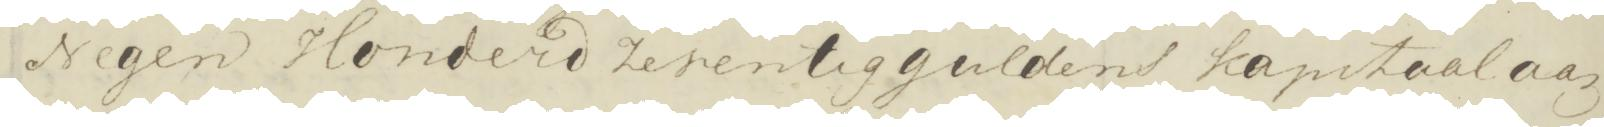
Negen Honderd zeventig guldens kapitaal aan
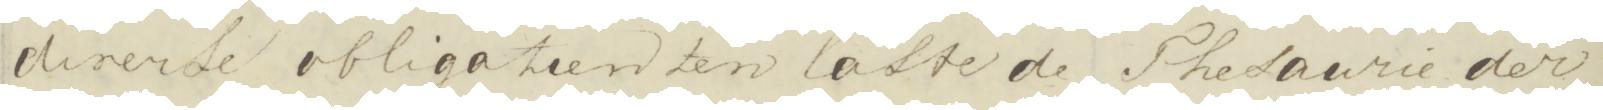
diverse obligatien ten laste de Thesaurie der
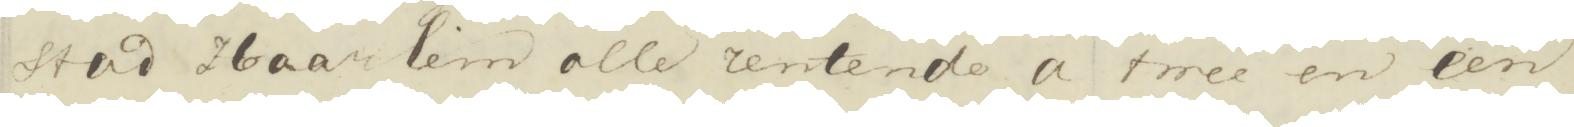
stad Haarlem alle rentende a twee en een
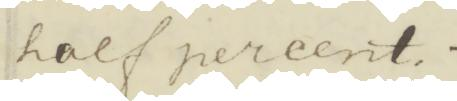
half percent.
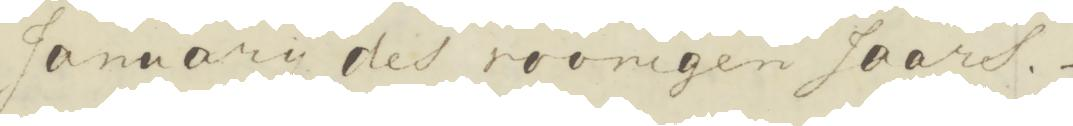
January des voorigen Jaars.
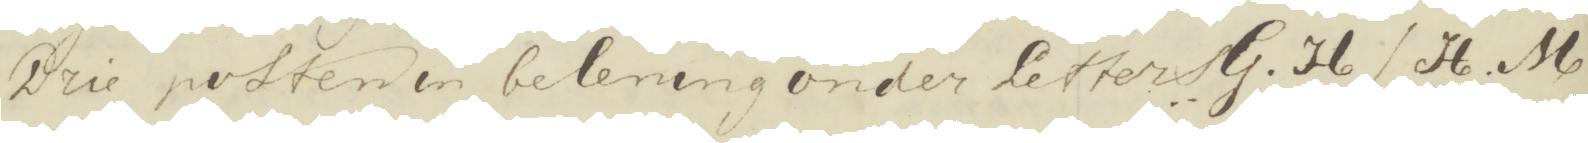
Drie posten en belening onder Letter G. H / H. M
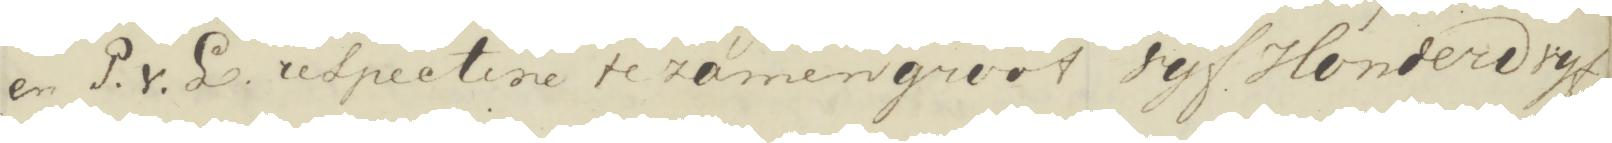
en P. v. L. respective tezamen groot vijf Honderd vyf
